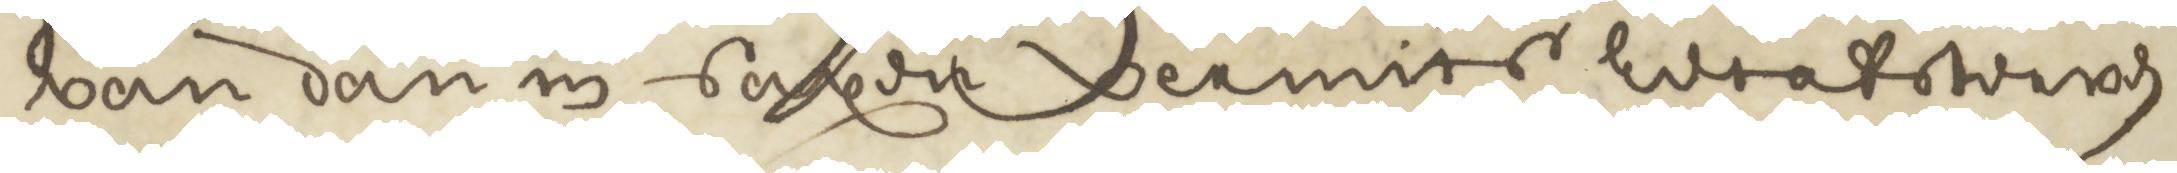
van dan in saxen vermits het afsterven
